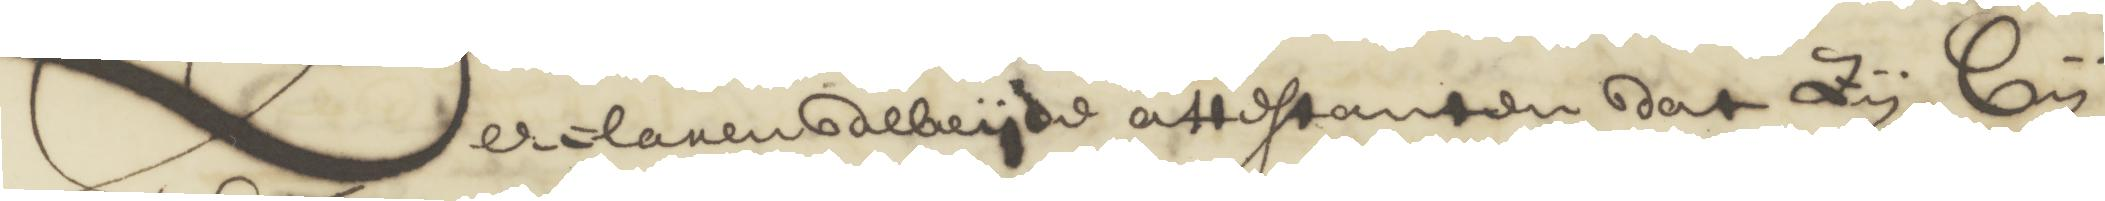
Verclaren debeijde attestanten dat Zij Bij
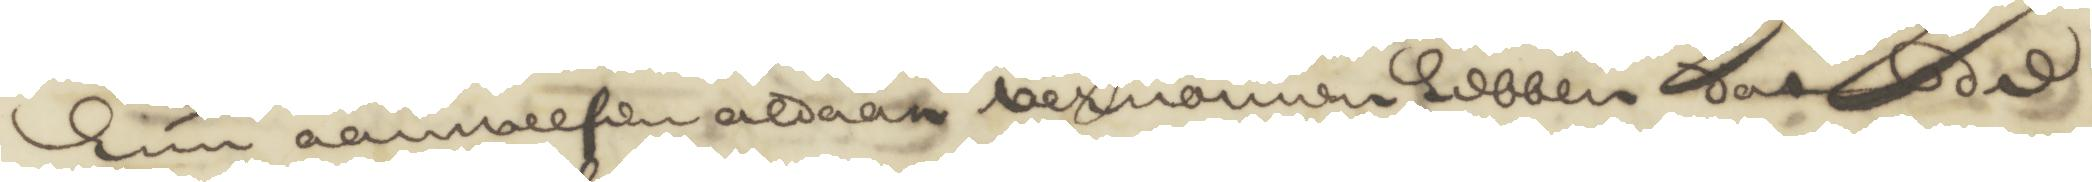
hun aanweesen aldaar vernomen hebben dat de
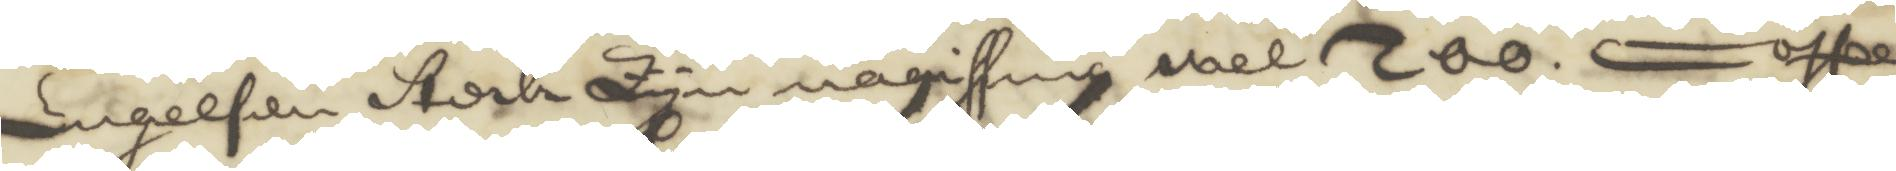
Engelsen sterk Zijn nagissing wel 200. Coppen
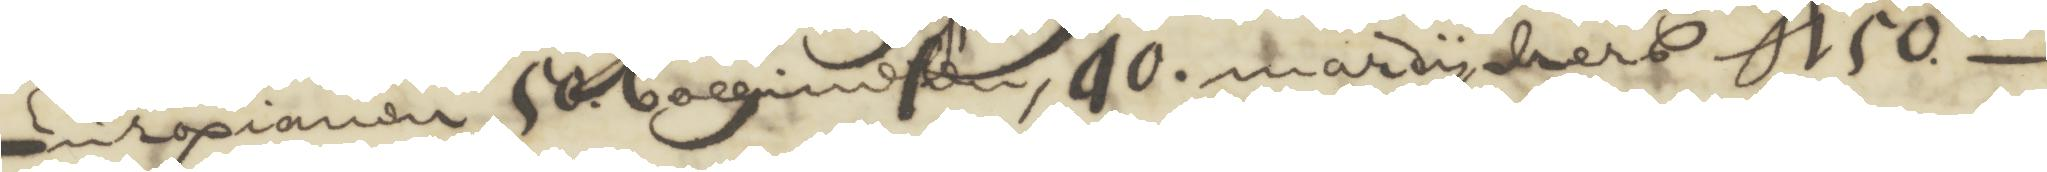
Europianen 50. boeginesen, 40. mardijkers 150.–
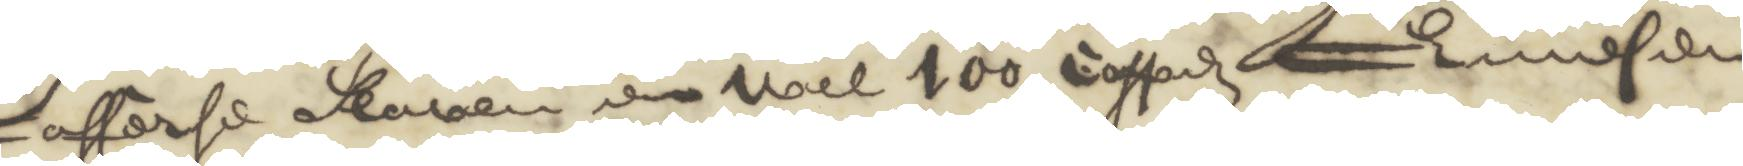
cafferse slaven en wel 100. coppen Chinesen
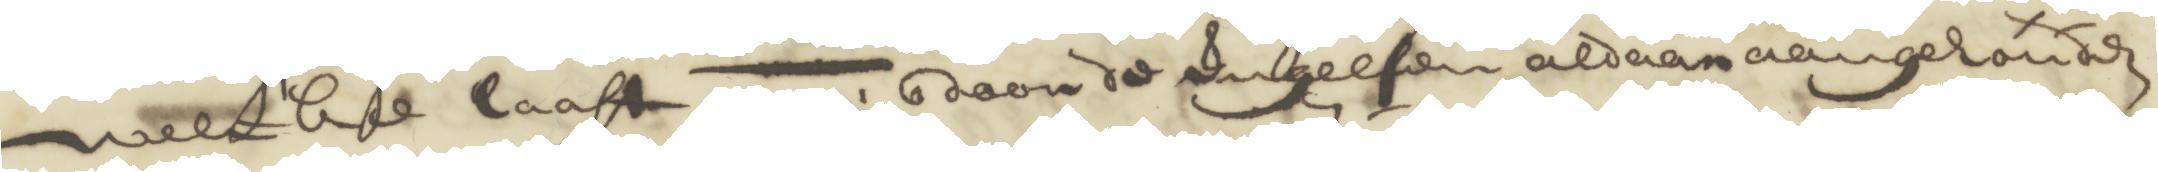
welcke laast gen: door de Engelsen aldaar aangehouden
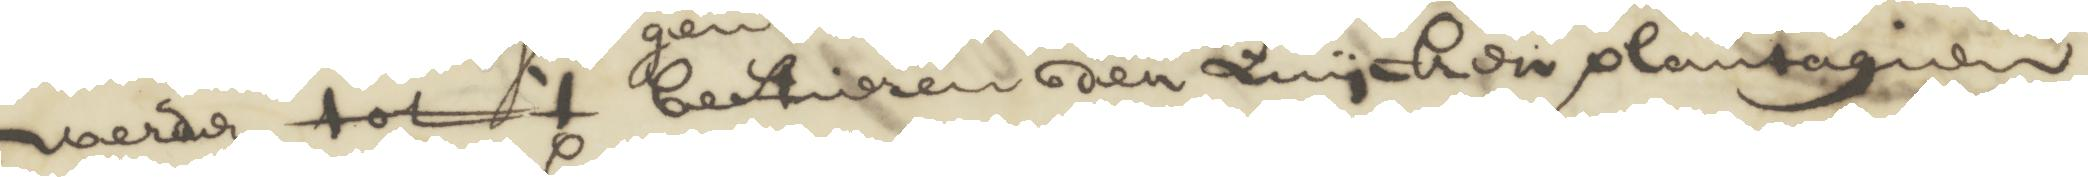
werden tot ’t bestieren den Zuijcker plantagien
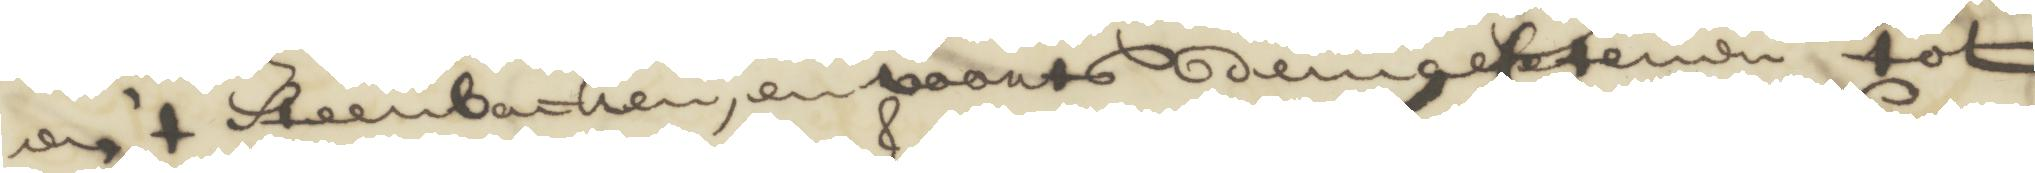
en ’t steenbacken, en voorts de ingesetenen tot
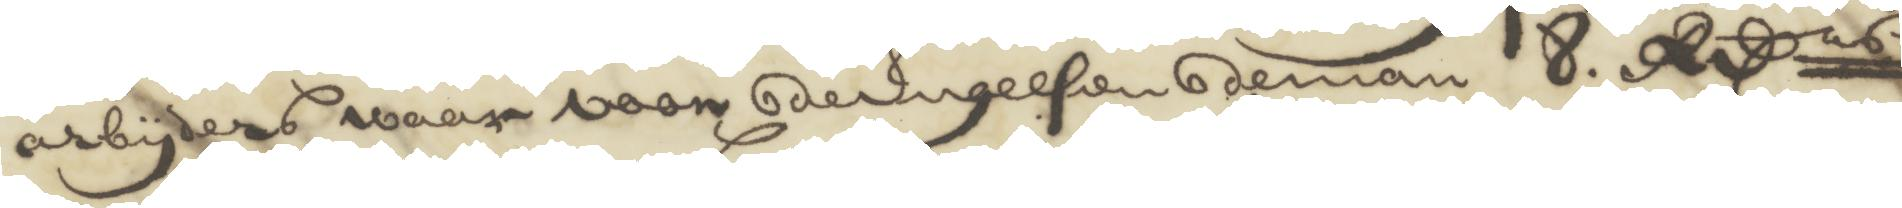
arbijders waar voor deEngelsen deman 8. RX=rs
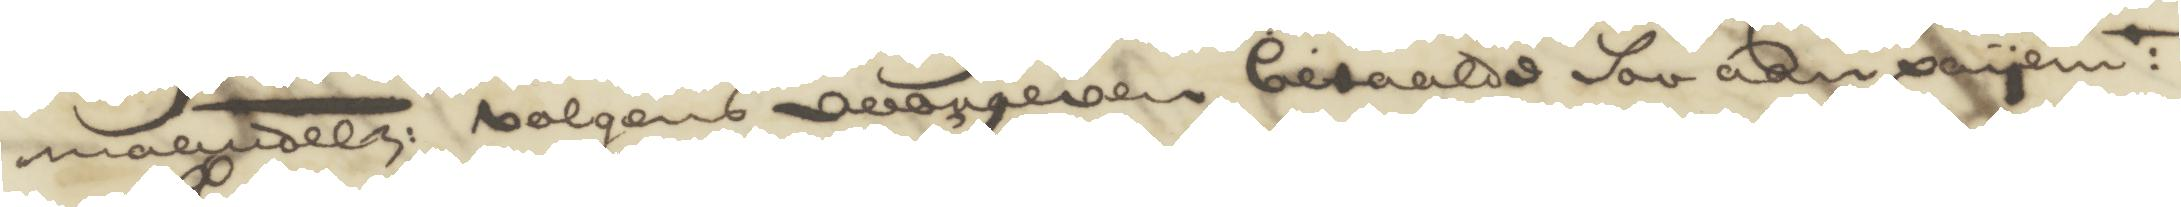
maandelijk: volgens voorgeven betaalde soo aan paijem:t
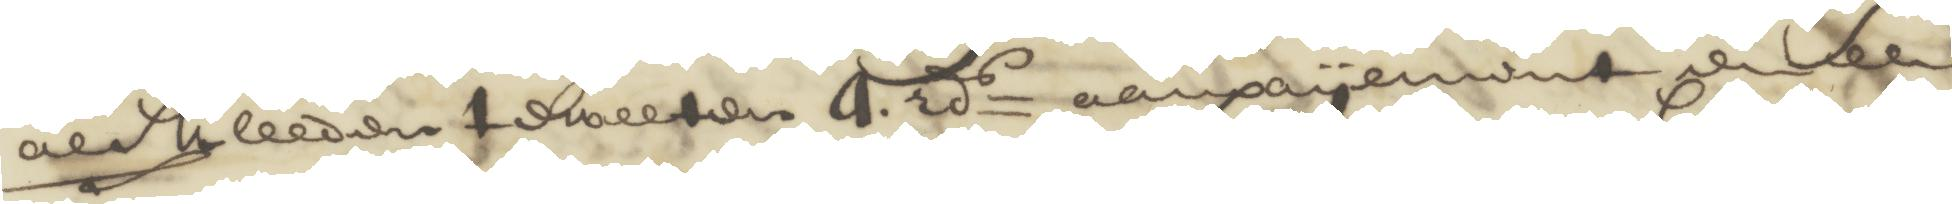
als kleeden teweeten 4. rd=s aanpaijement en een
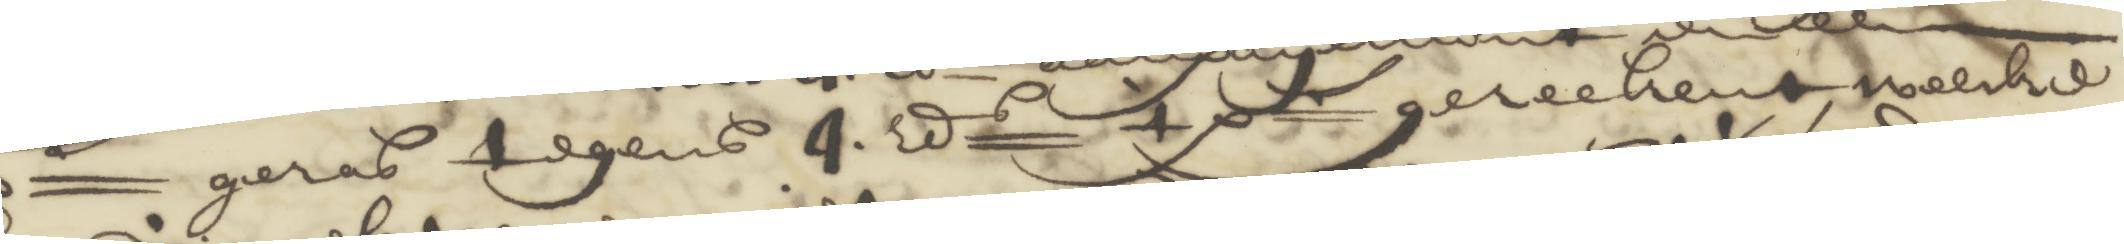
=s geras tegens 4. rd=s 't p=s gereekent, welcke
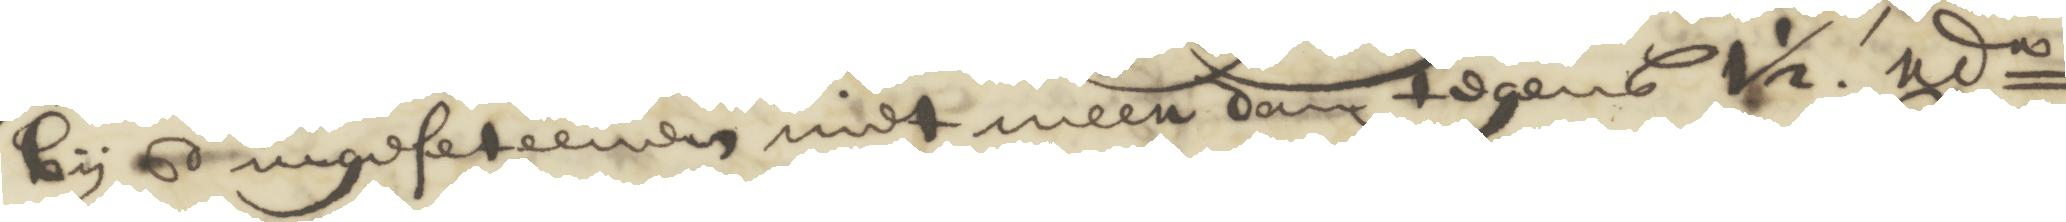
bij d' ingeseteenen niet meer dan tegens 1½. rd=r
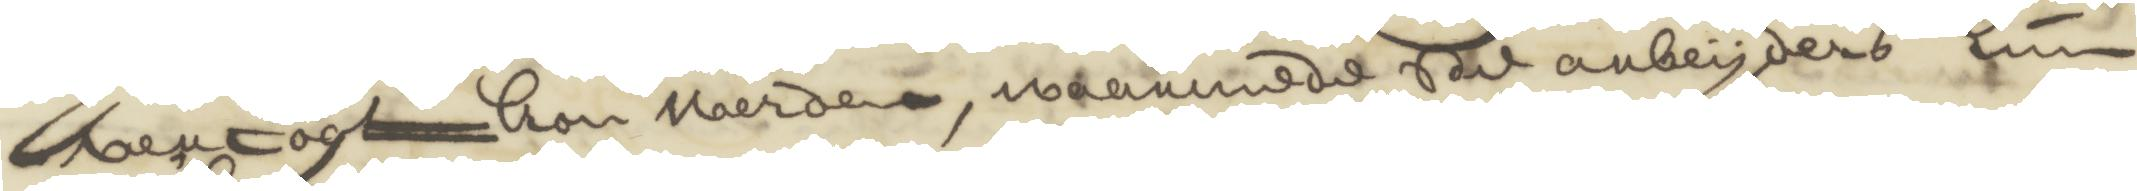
vercogt kon werden, waarmede de arbeijders hun
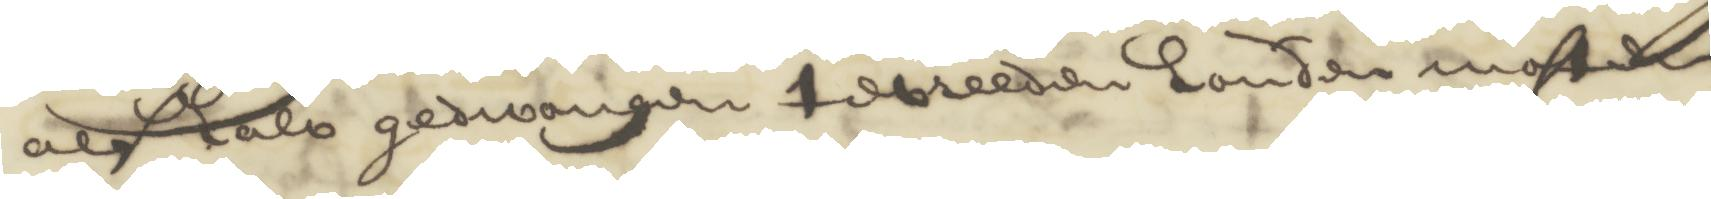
als halv gedwongen tevreeden houden mosten.
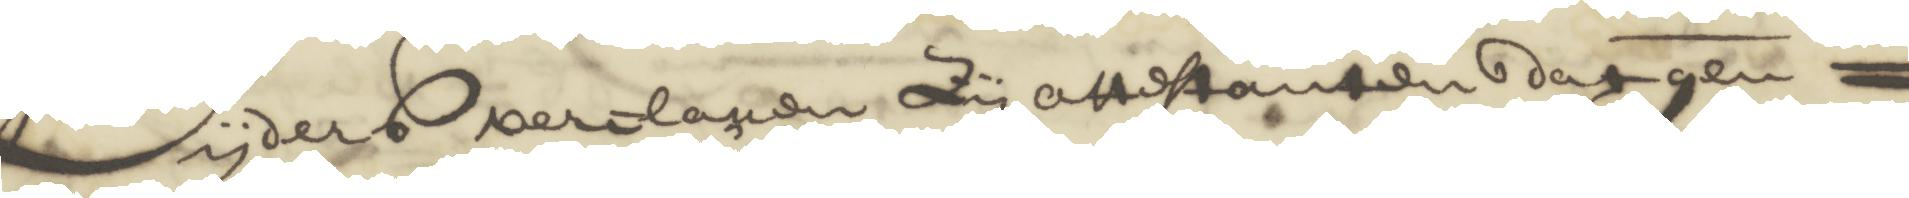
Wijders verclaren Zij attestanten dat gen=
